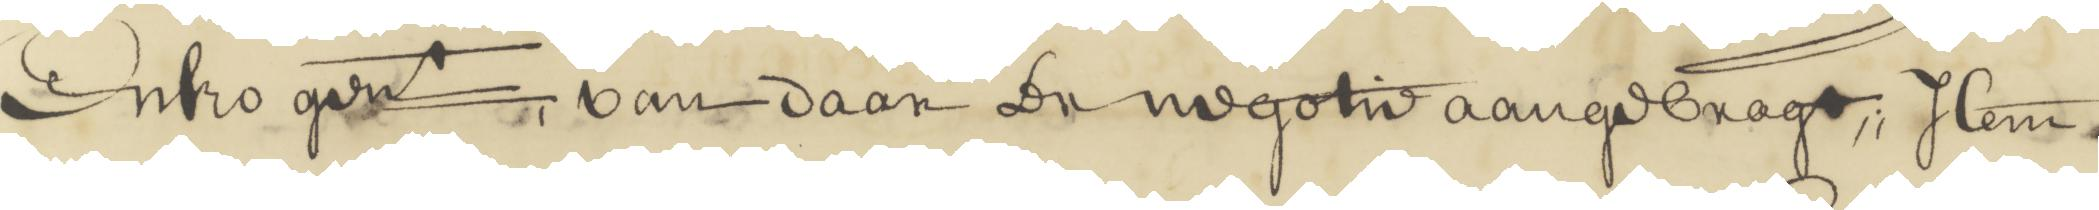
Enko gen=t, van daar ter negotie aangebragt,; Jtem
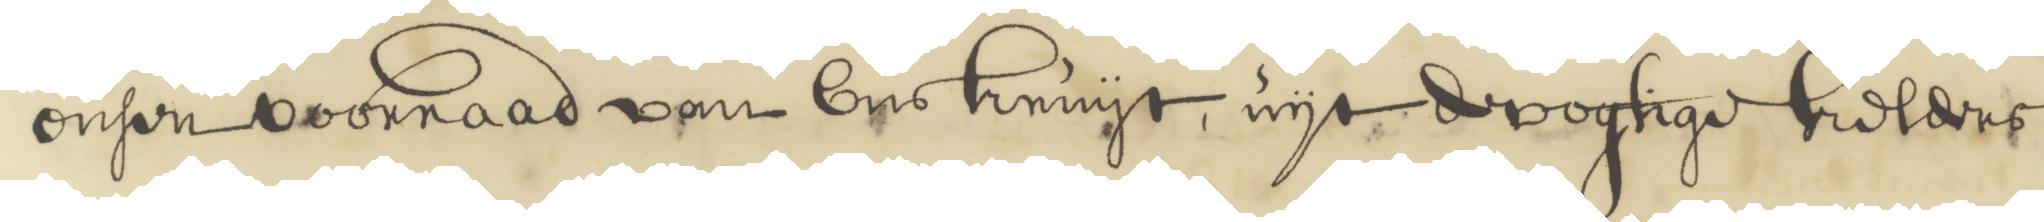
onsen voorraad van buskruijt, uijt de vogtige kelders
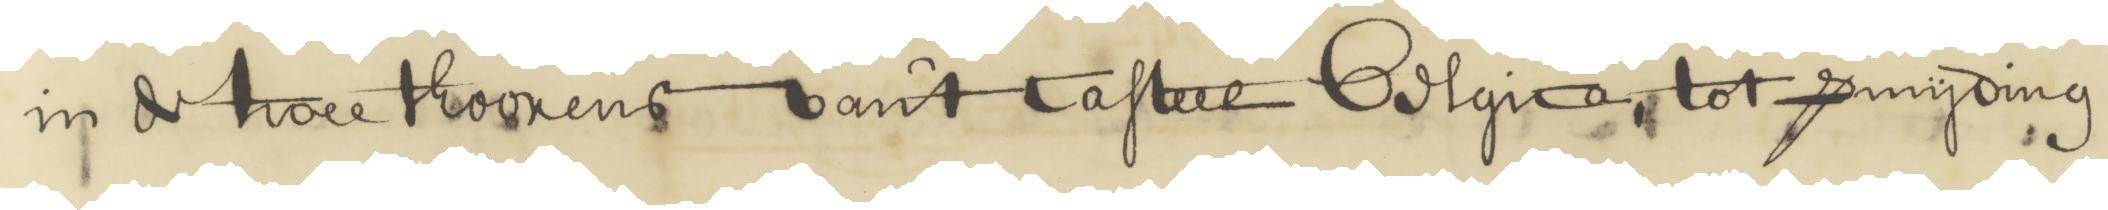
in de twee thoorens van't Casteel belgica tot vermijding
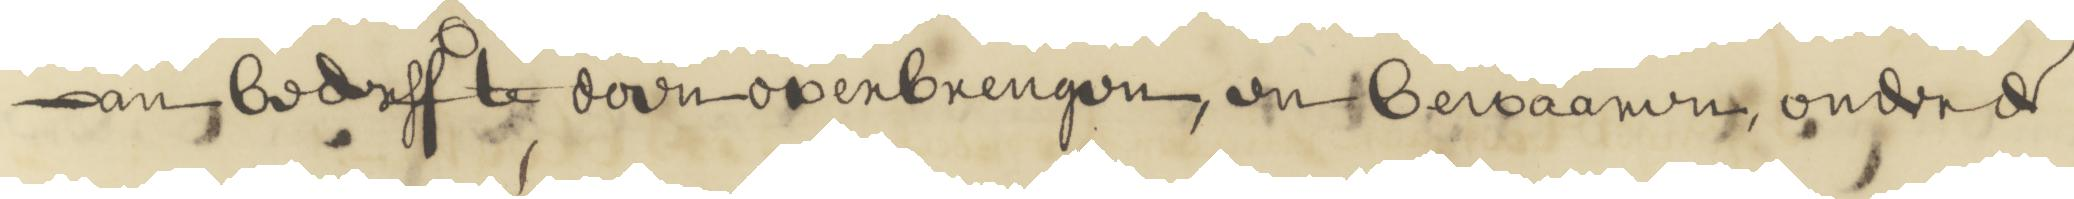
van bederff te doen overbrengen, en bewaaren, onder de
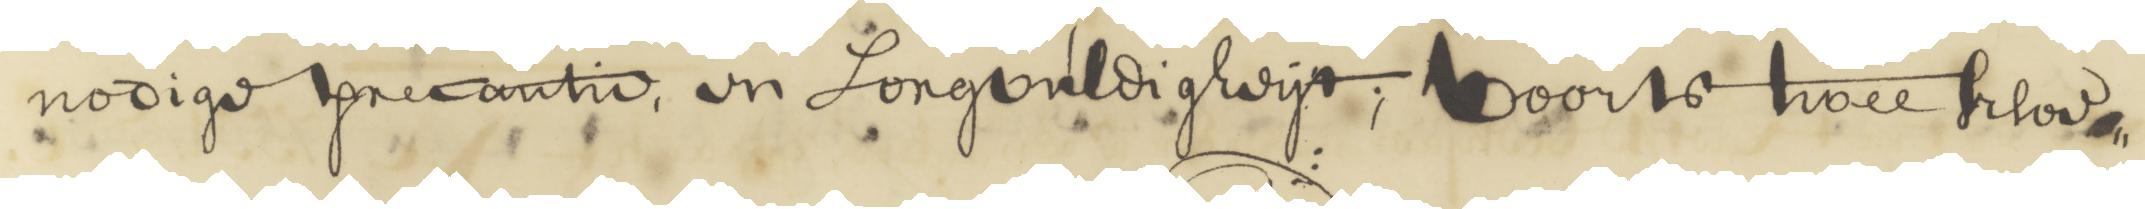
nodige precautie, en sorgvuldigheijt, voorts twee kloe„
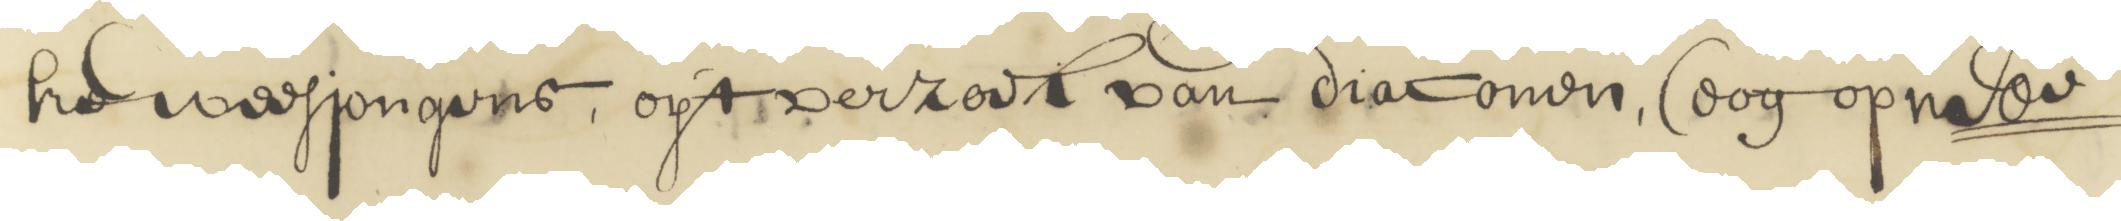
ke weesjongens, op ’t verzoek van diaconen, (dog op u Ed=le
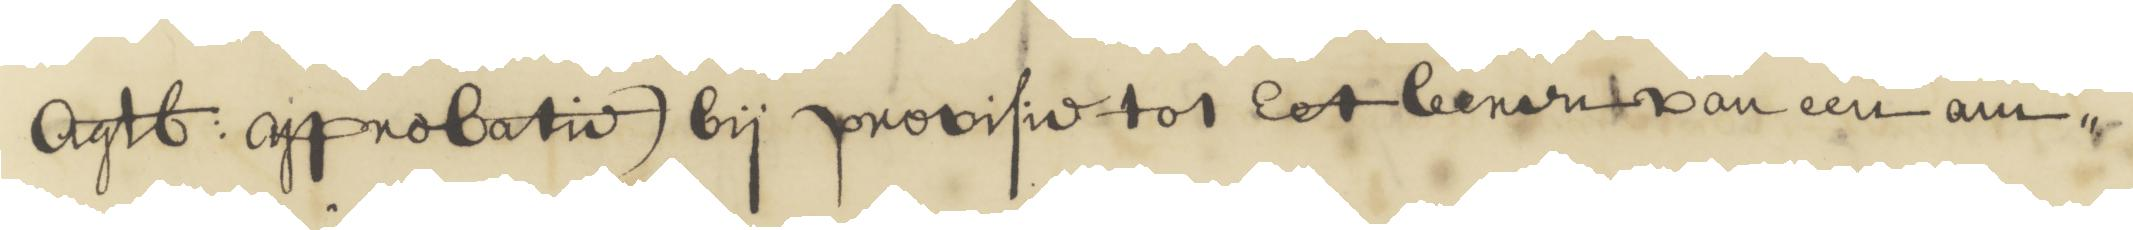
Agtb: approbatie) bij provisie tot het leeren van een am„
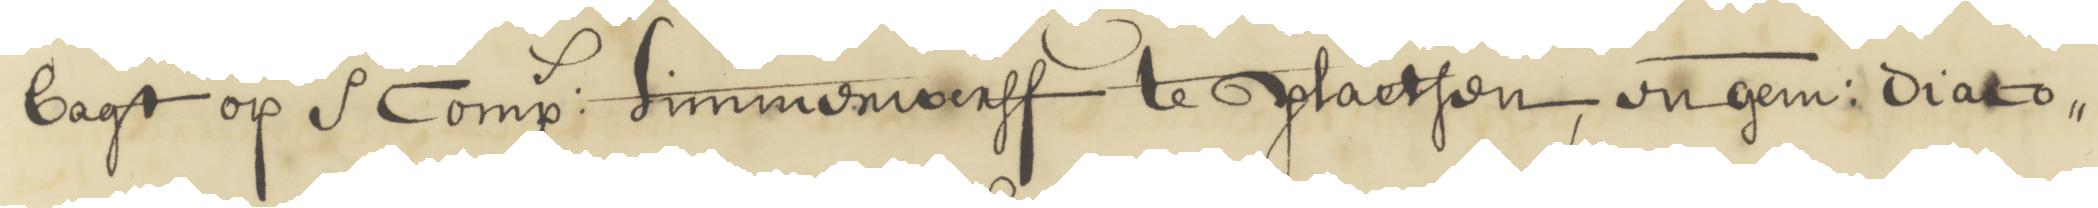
bagt op ’s Comp:s timmerwerff te plaetsen, en gem: diaco„
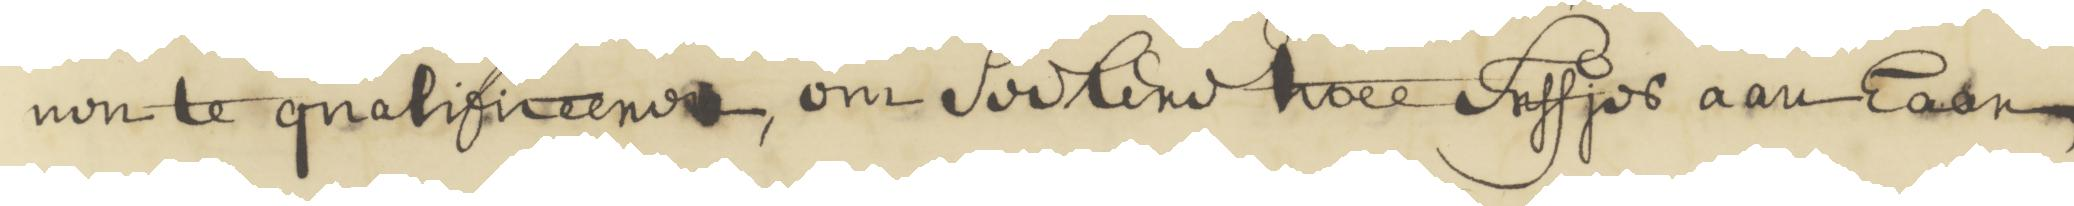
nen te qualificeeren, om seekere twee Erffjes aan haar
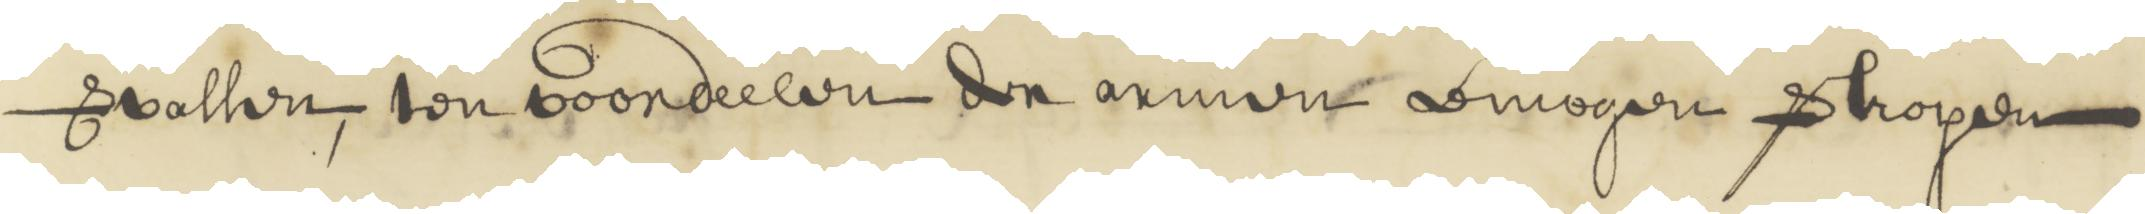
vervallen, ten voordeelen der armen te mogen verkopen
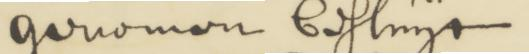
genomen besluijt
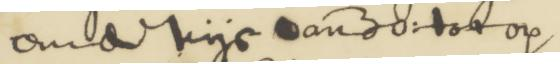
om de rijs van 30: tot op
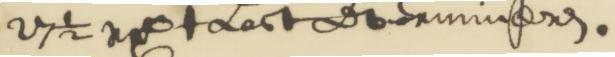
27½ rC t Last te verminderen
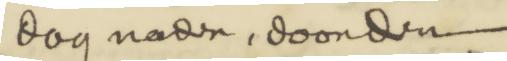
dog nader, door den
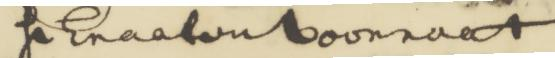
schraalen voorraat
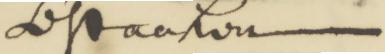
testaaken
